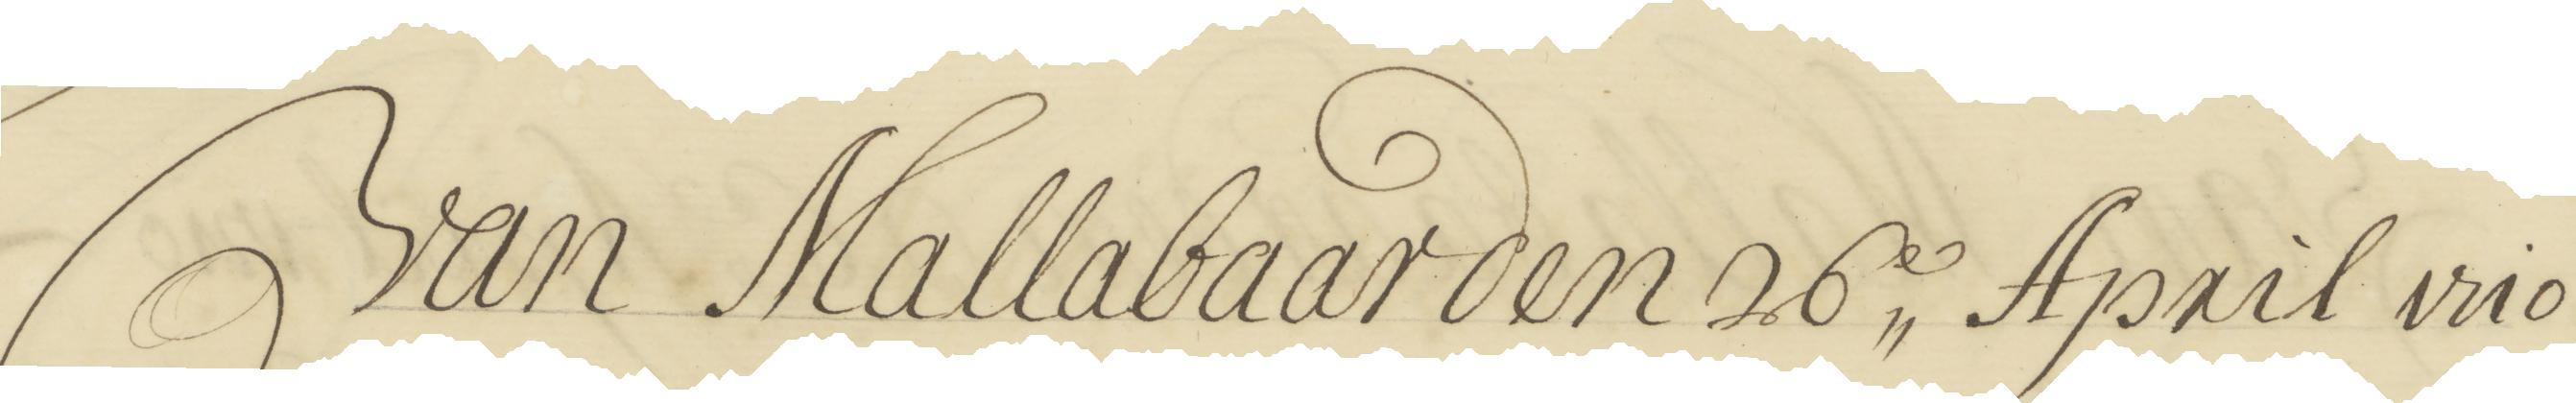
Van Mallabaar den 26„e April 1710
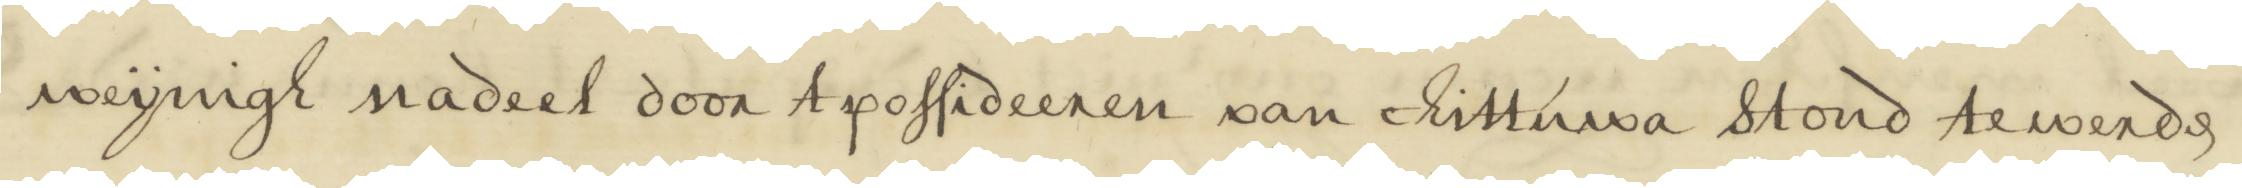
weijnigh nadeel door t possideeren van chittuwa stond te werden
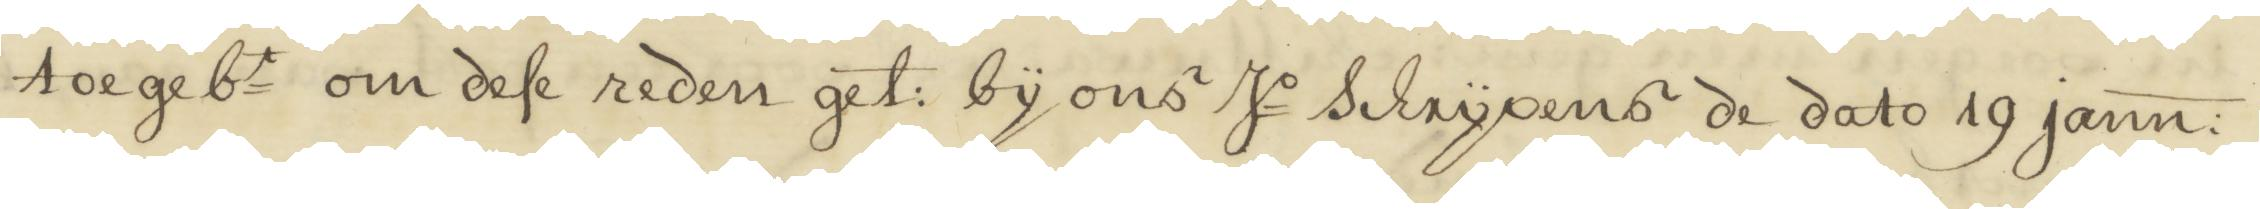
toegeb=t om dese reden get: bij ons J=o schrijvens de dato 19 janu:
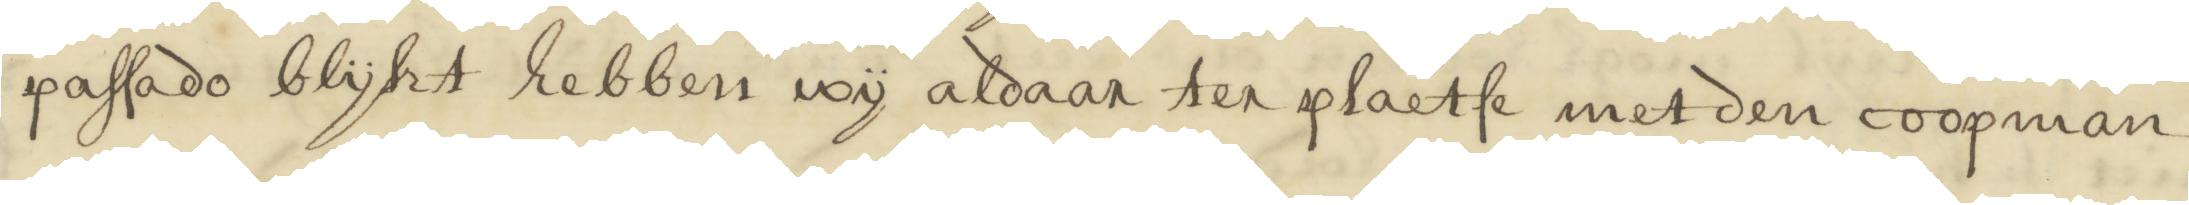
passado blijkt hebben wij aldaar ter plaetse met den coopman
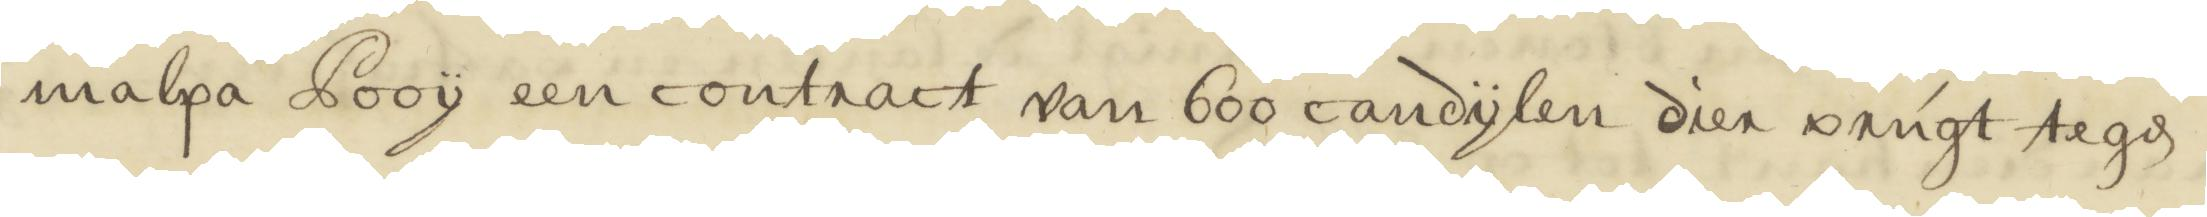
malpa Pooij een contract van 600 candijlen dier vrugt tegen
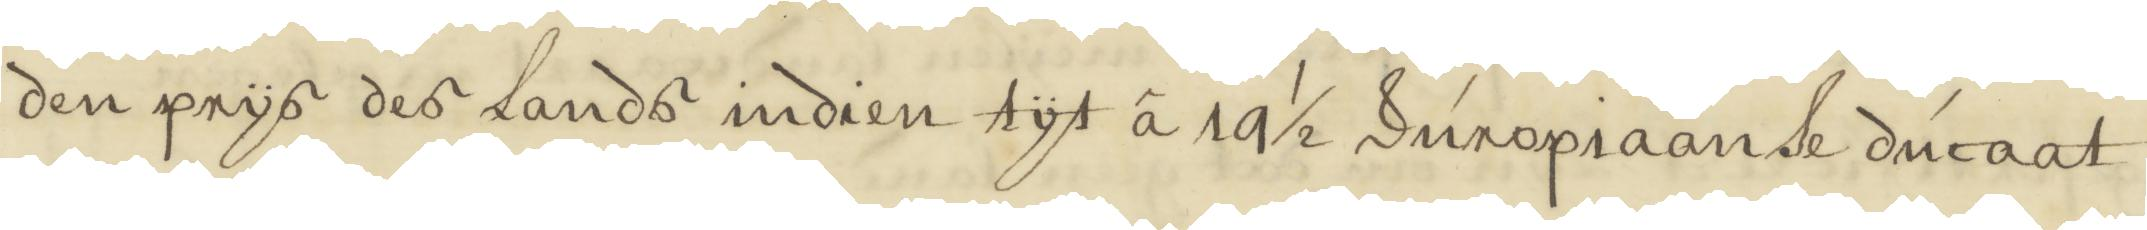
den prijs des lands indien tijt â 14½ Europiaanse ducaat
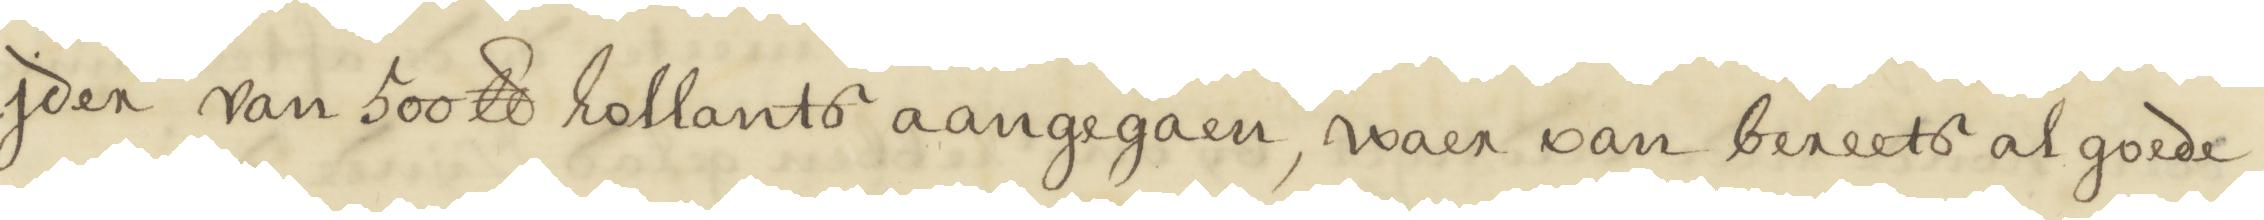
jder van 500 lb hollants aangegaen, waer van bereets al goede
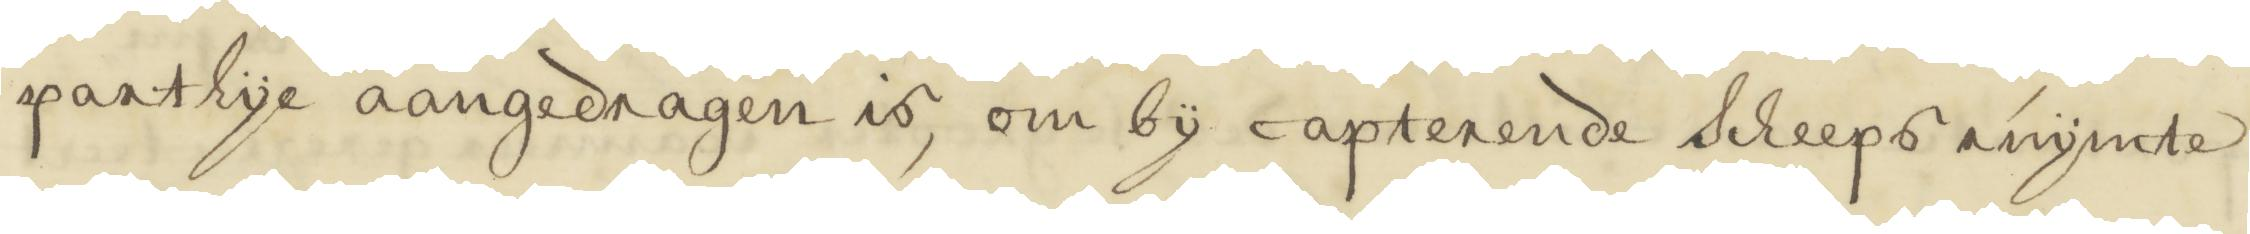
parthije aangedragen is, om bij capterende scheeps ruijmte
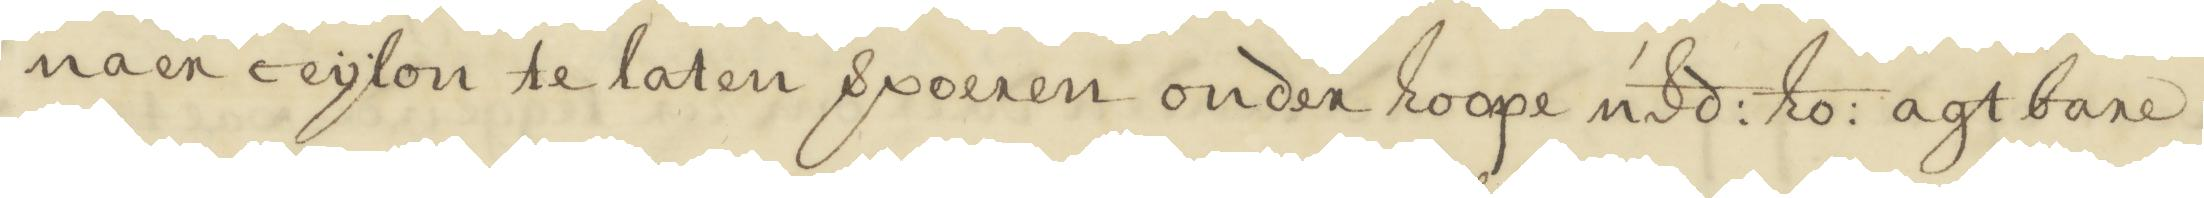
naer ceijlon te laten vervoeren onder hoope uEd: ho: agtbare
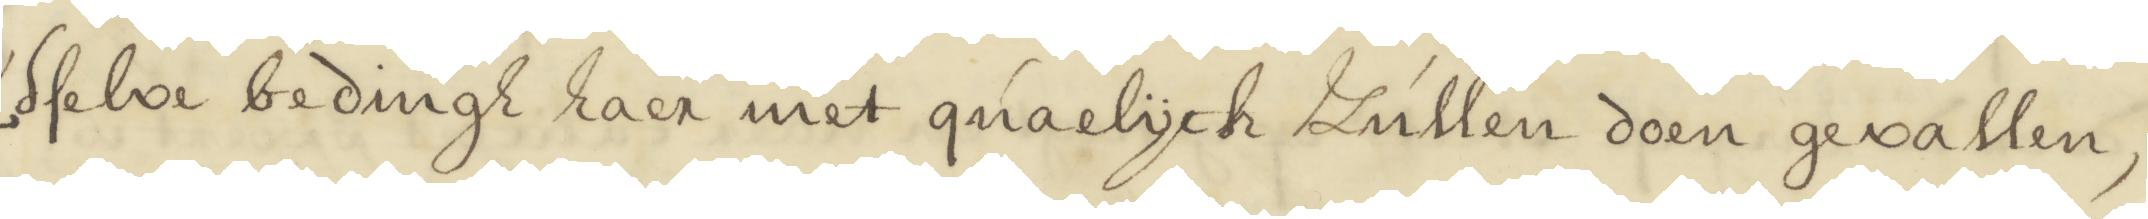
t selve bedingh haer niet quaelijck zullen doen gevallen
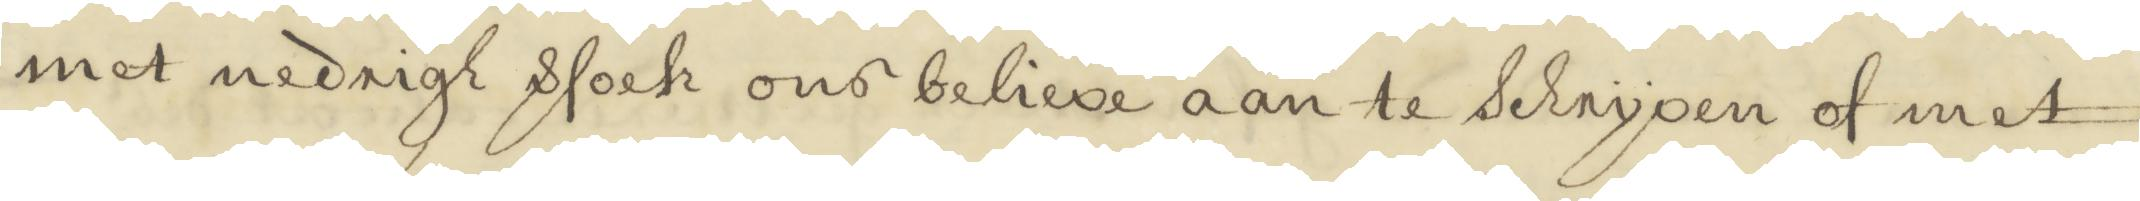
met nedrigh versoek ons believe aan te schrijven of met
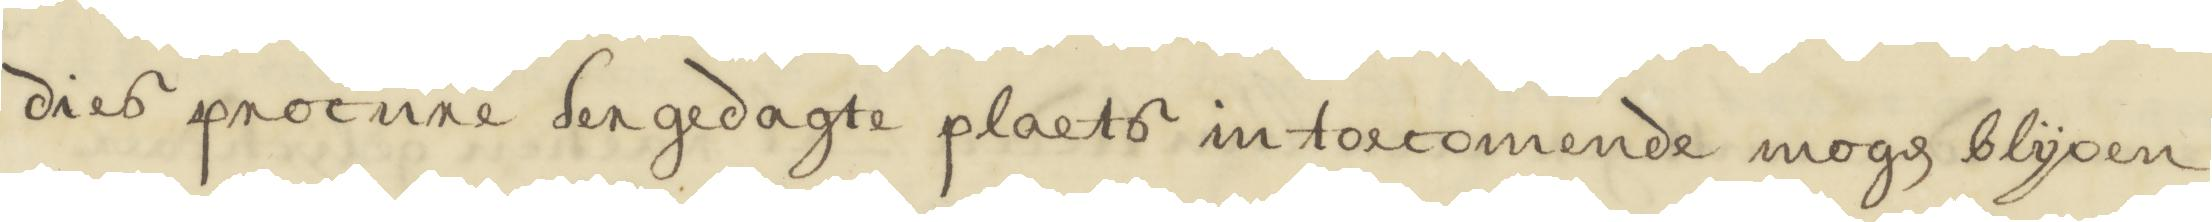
dies procure ter gedagte plaets in toecomende mogen blijven
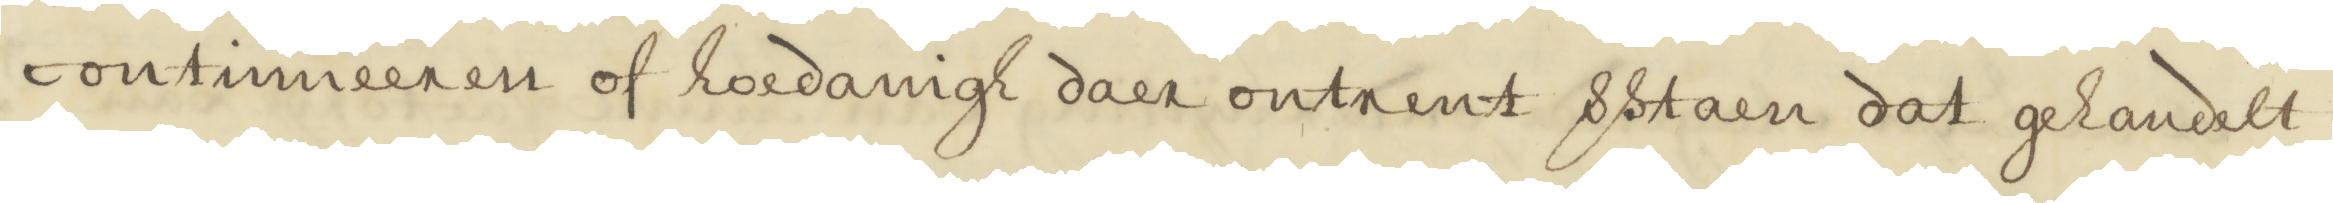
continueeren of hoedanigh daer ontrent verstaen dat gehandelt
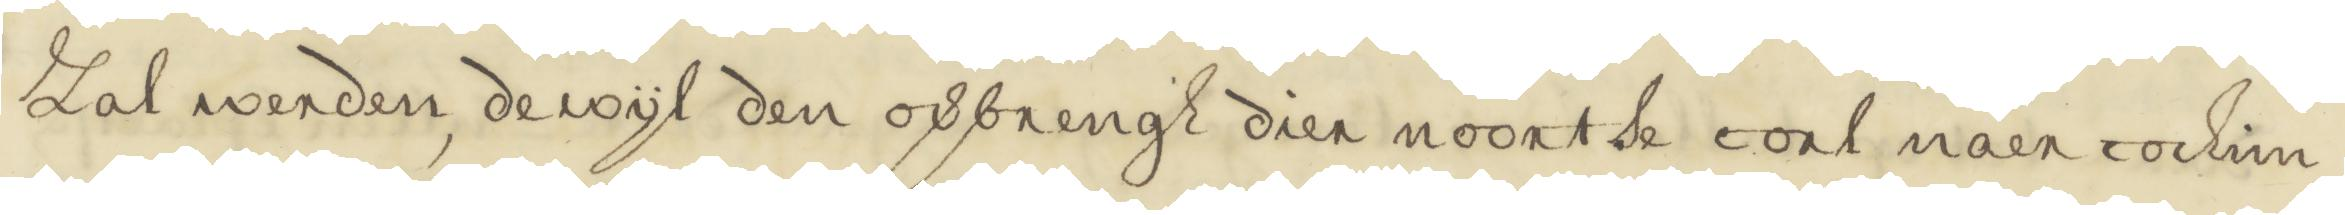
zal werden, dewijl den overbrengh dier noortse corl naer cochin
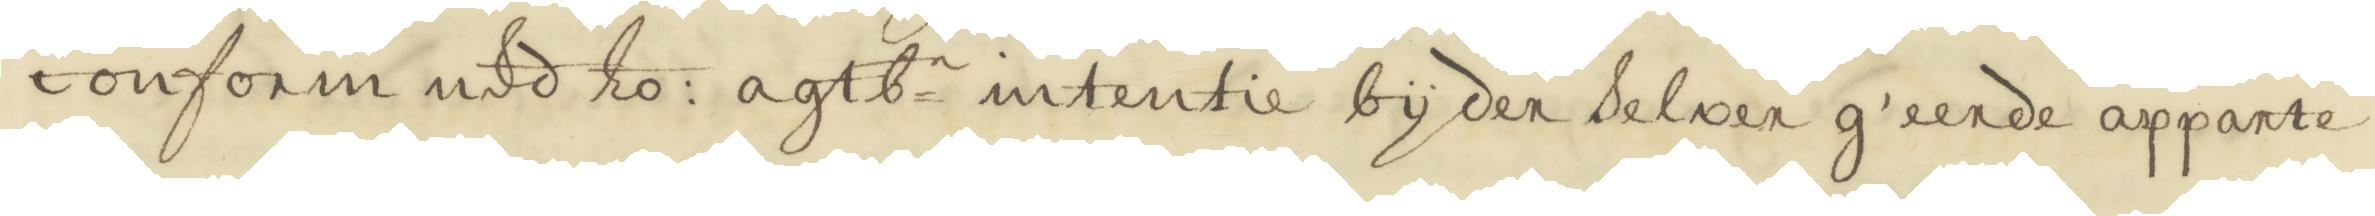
conform uEd ho: agtb=r intentie bij der selver g’eerde apparte
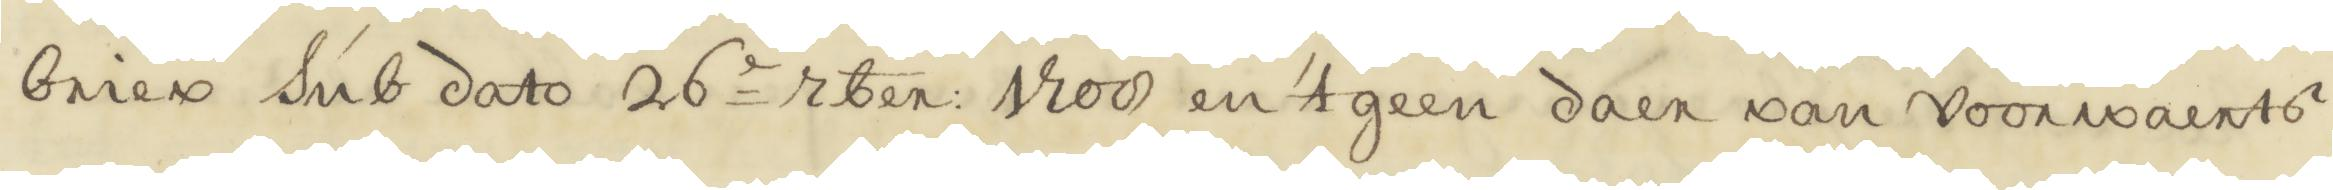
briev sub dato 26=e 7ber: 1708 en ’t geen daer van voorwaerts
